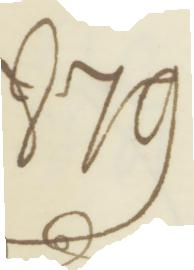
1879
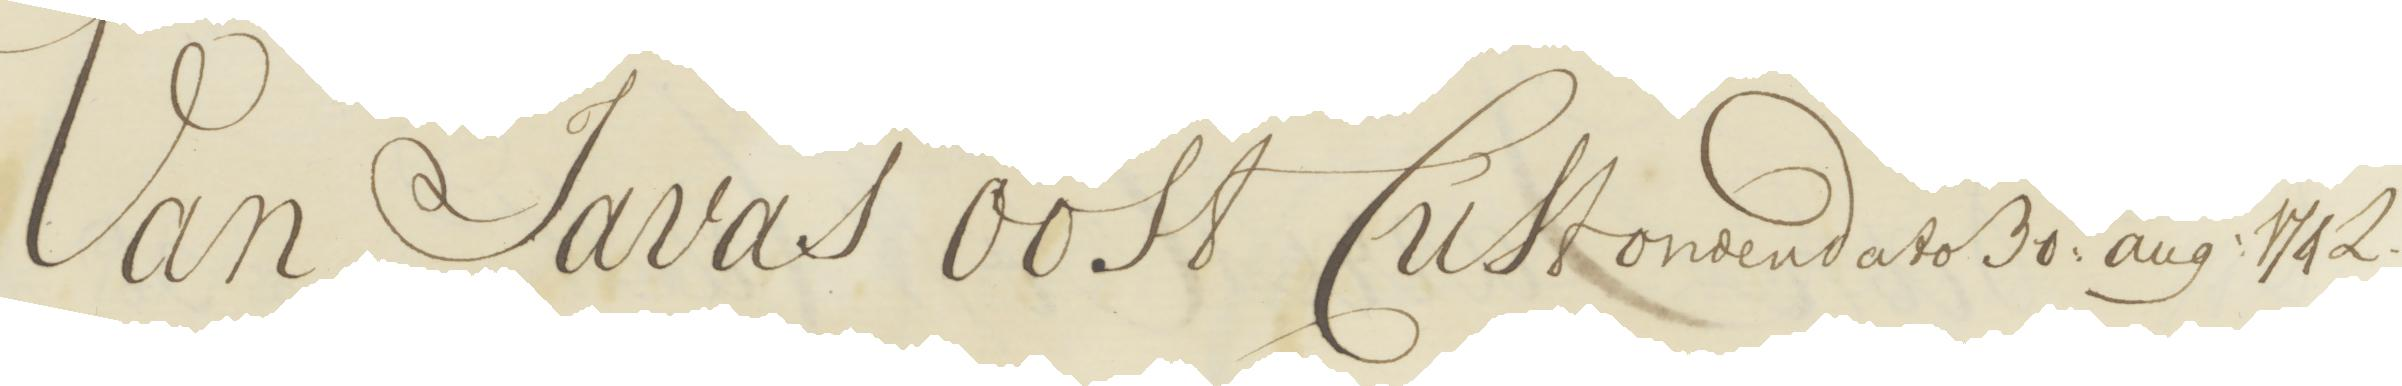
Van Iavas oost Cust onderdato 30:' aug:s 1742.
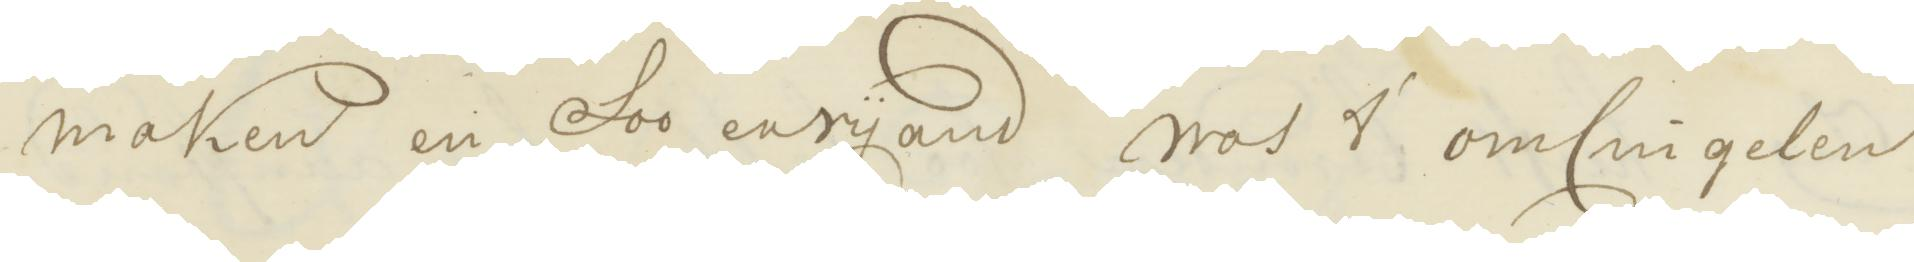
maken en soo er vijand was t' omcingelen
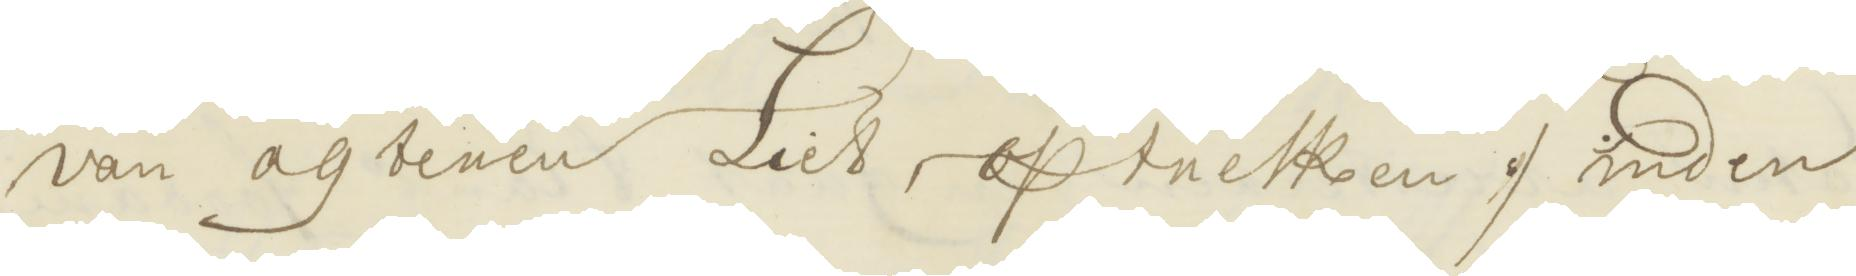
van agteren liet optrekken :/ inden
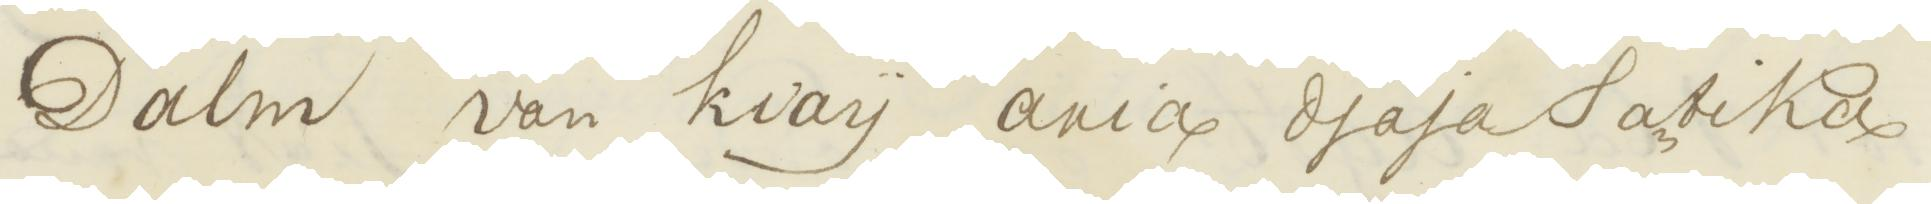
Dalm van kvaij aria djaja santika
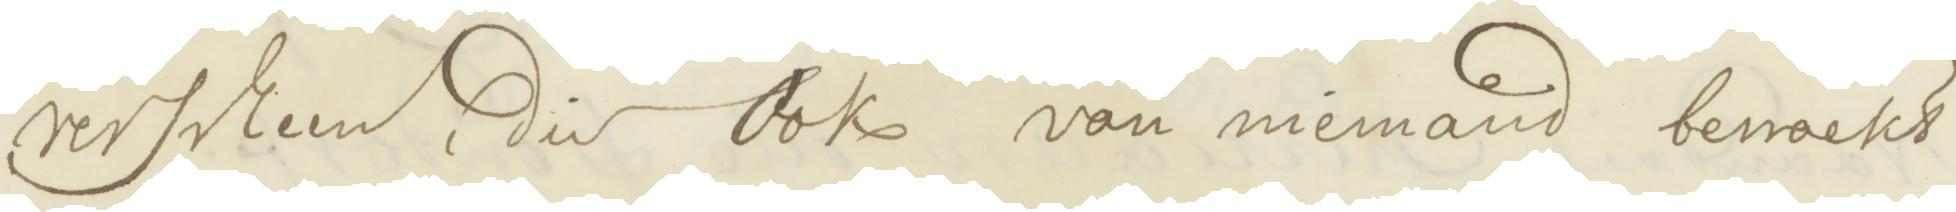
verscheen, die ook van niemand bewolkt
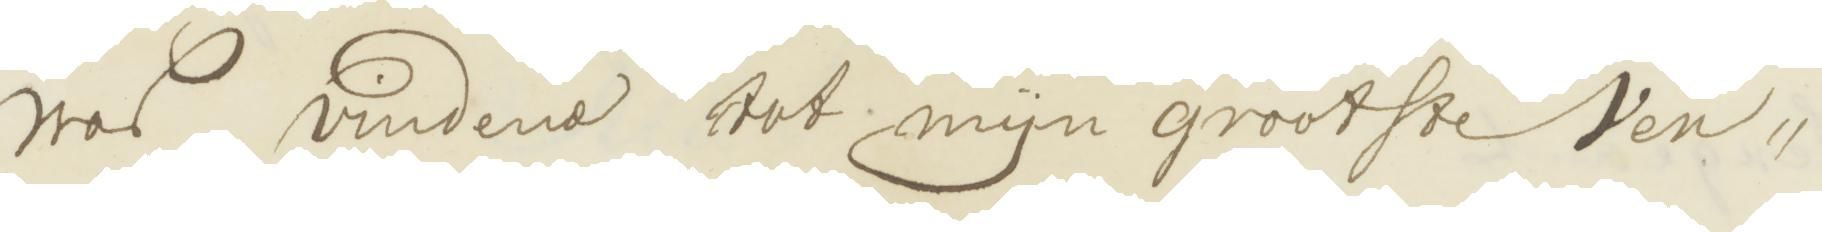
was vindend tot mijn grootste ver„
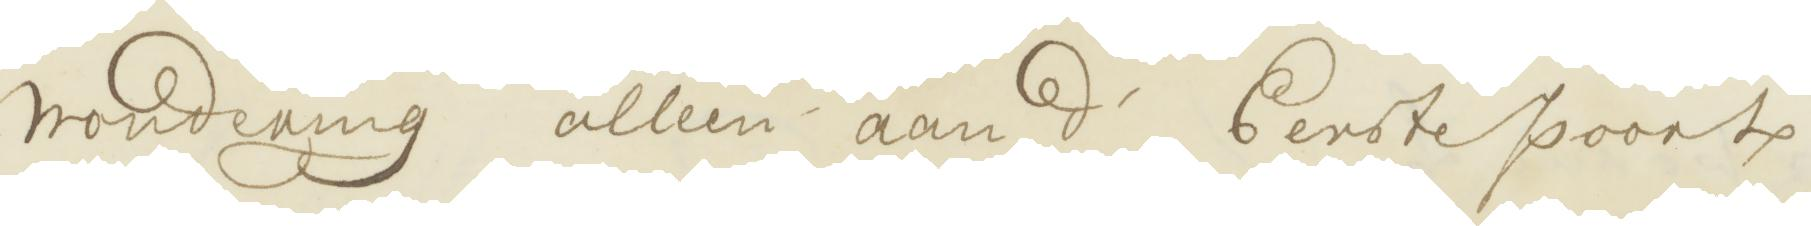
wondering alleen aan d’ Eerste poorte
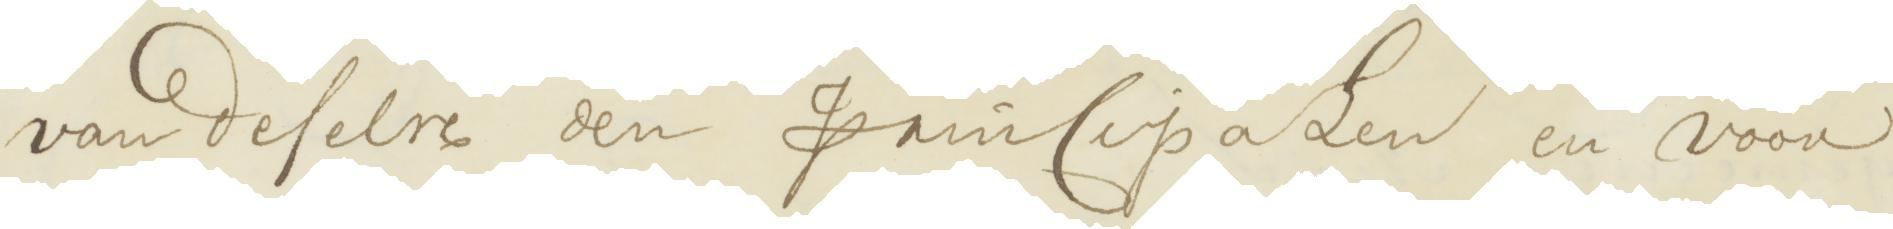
van deselve den principalen en voor
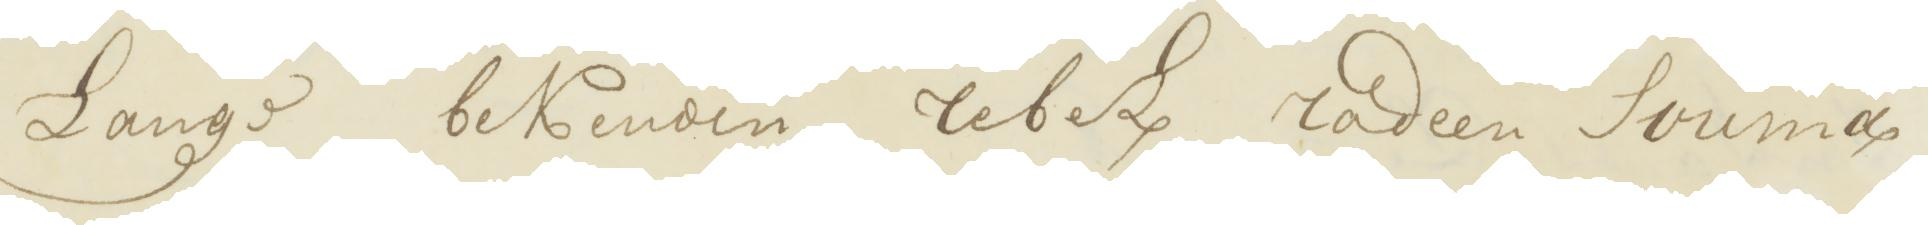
lange bekenden rebel radeen souma
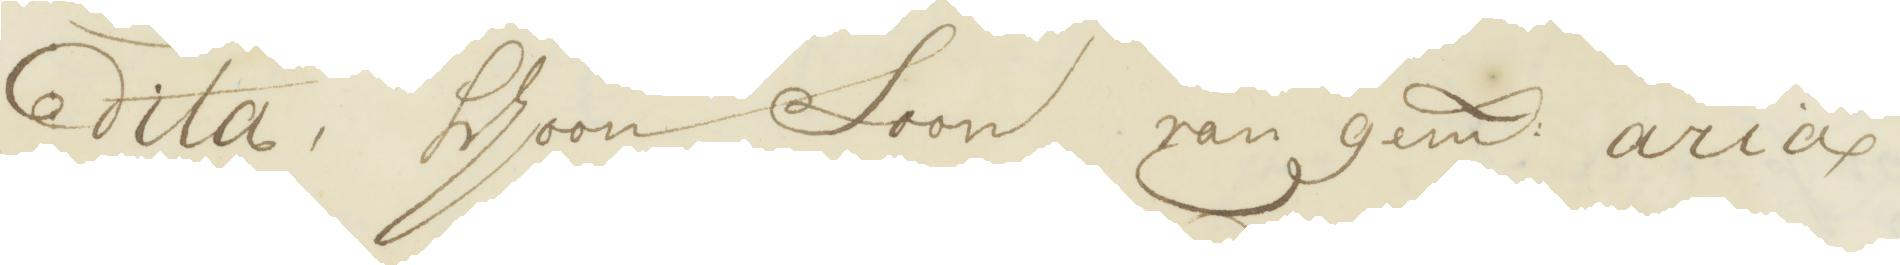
dita, schoon soon van gem: aria
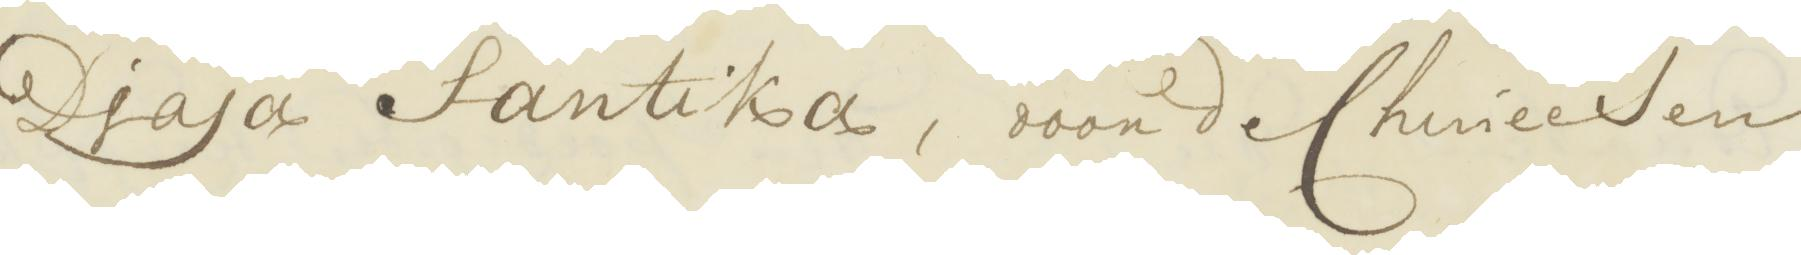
Djaja santika, door de Chineesen
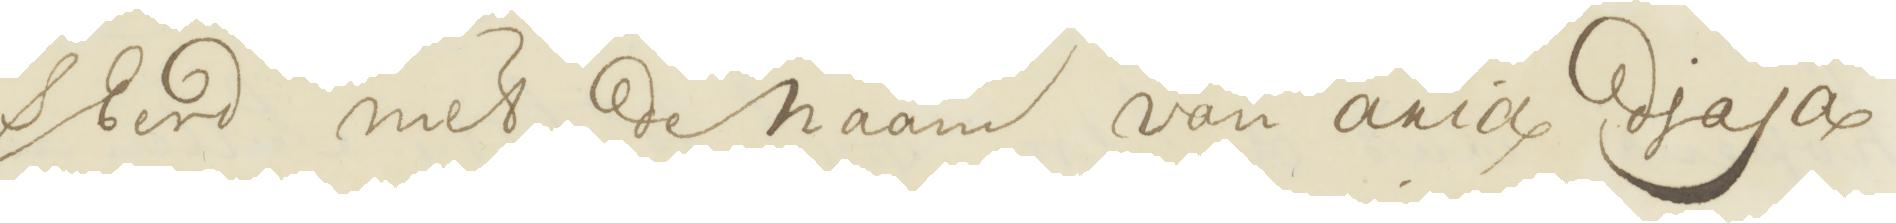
vereerd met de naam van aria djaja
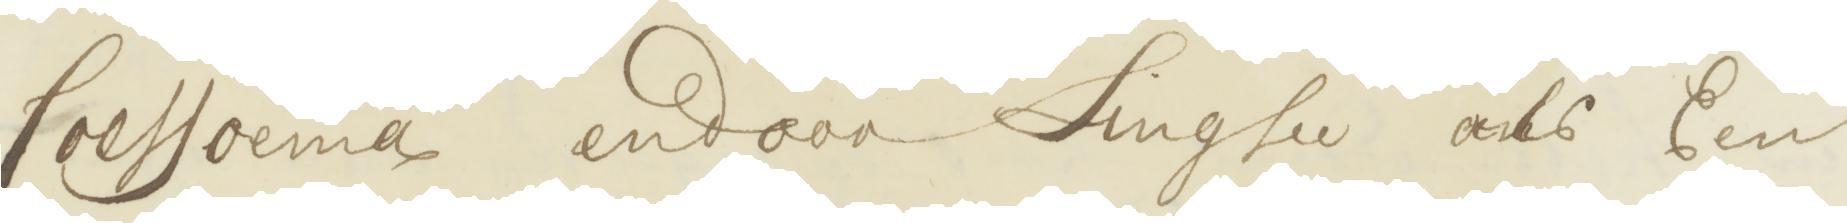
Coessoema endoor singlee als Een
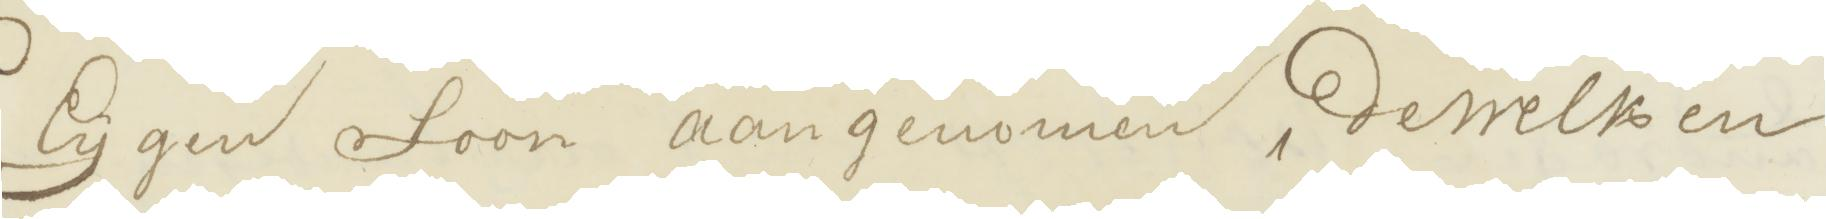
Eijgen soon aangenomen, dewelken
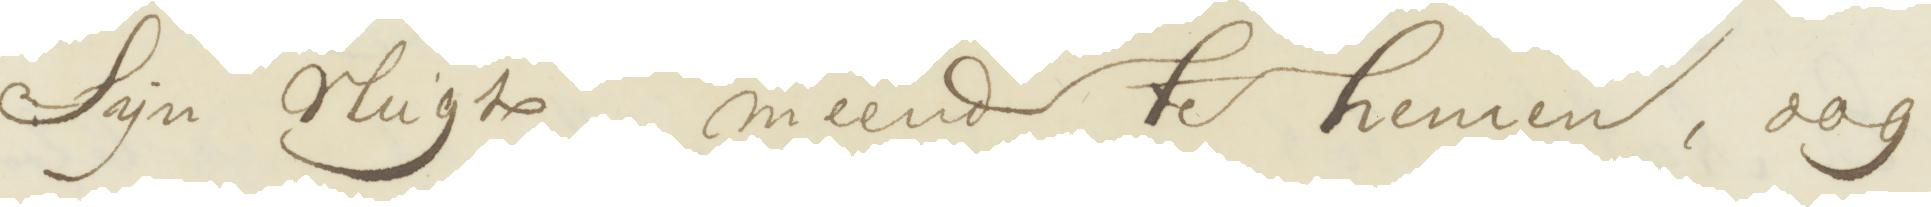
sijn vlugt meende te hemen, dog
